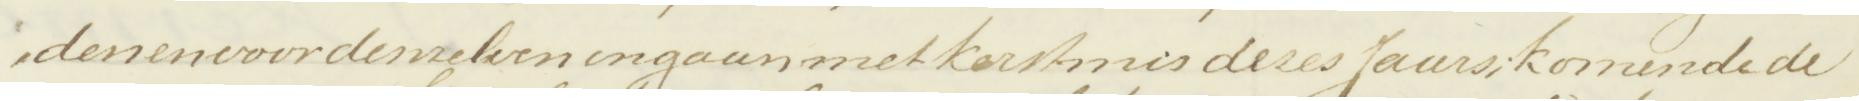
„den en voor denzelven ingaan met kerstmis dezes Jaars, komende de
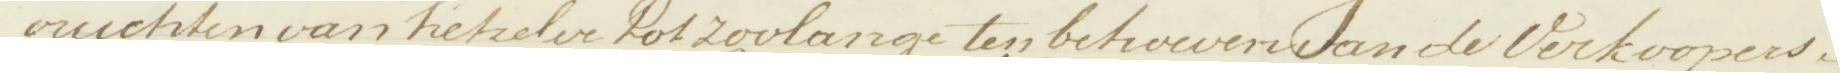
vruchten van hetzelve tot zoolange ten behoeven van de Verkoopers,
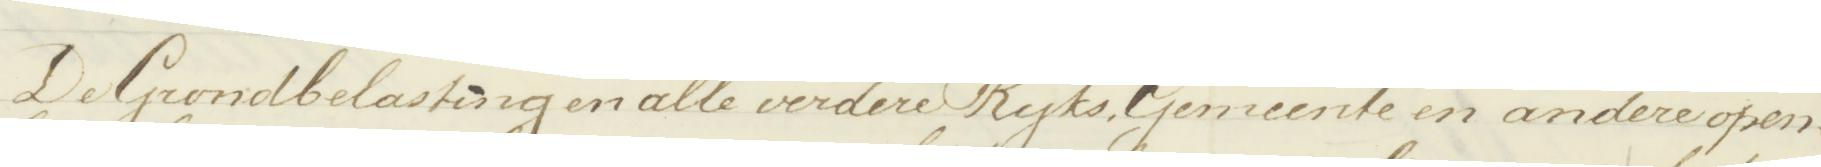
De Grondbelasting en alle verdere Ryks, Gemeente en andere open
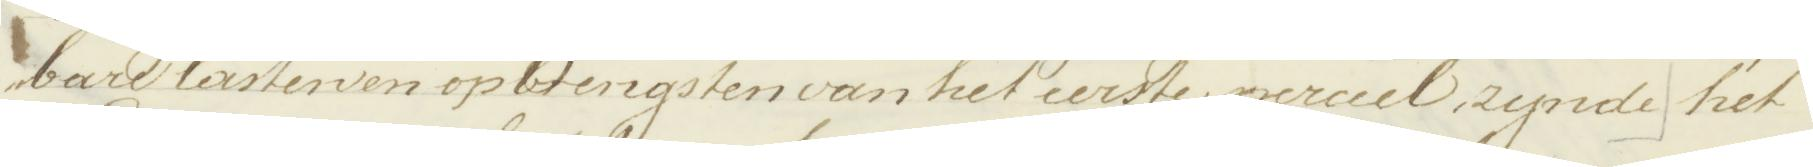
bare lasten en opbrengsten van het eerste perceel, zynde het
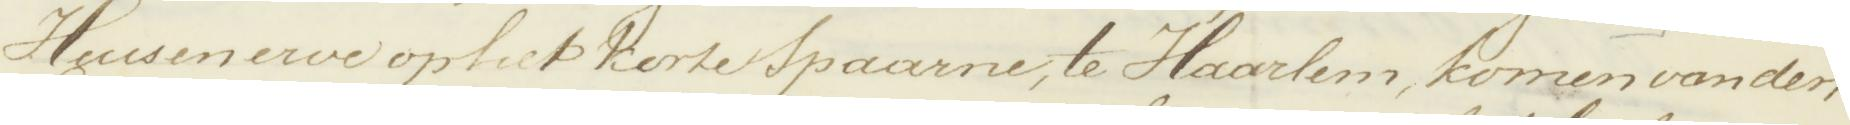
Huis en erve op het Korte Spaarne, te Haarlem, komen van den
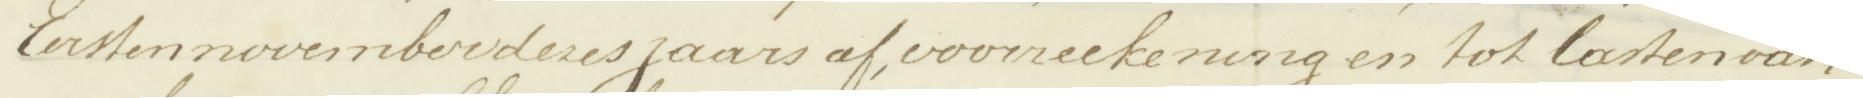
Eersten november dezes jaars af, voor reekening en tot lasten van
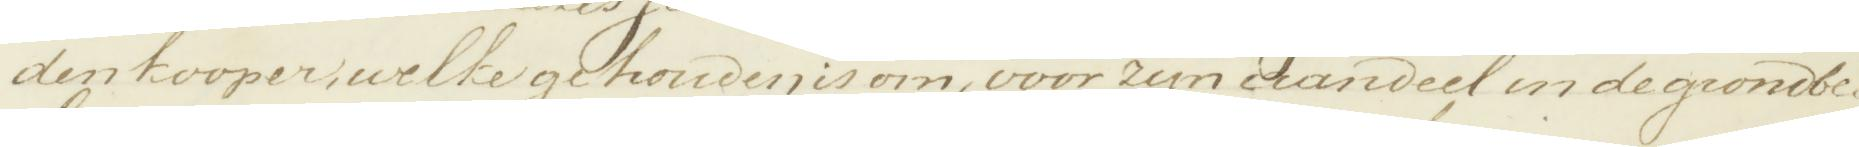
den kooper, welke gehouden is om, voor zyn aandeel in de grondbe.
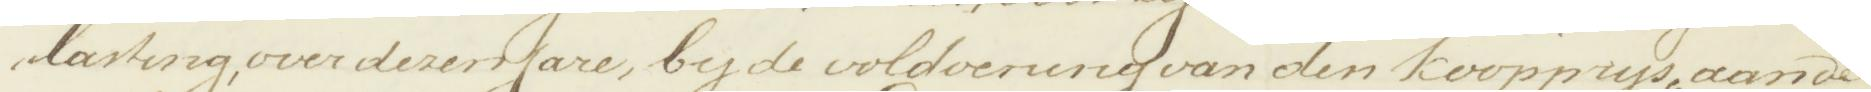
„lasting, over dezen jare, by de voldoening van den koopprys, aan de
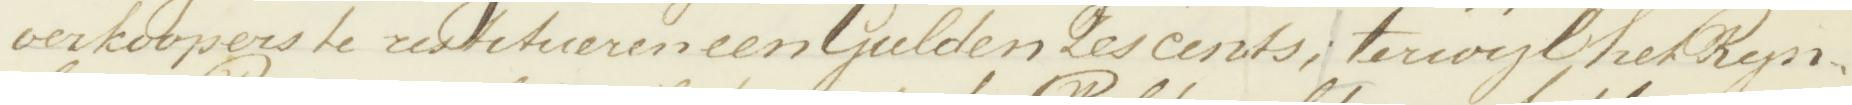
verkoopers te restitueren een Gulden zes cents;/ terwyl het Ryn„
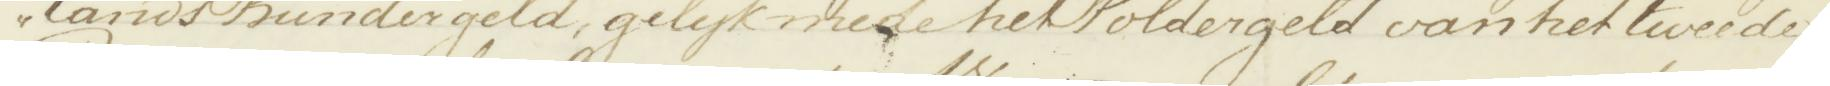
„lands Bundergeld, gelyk mede het Poldergeld van het tweede
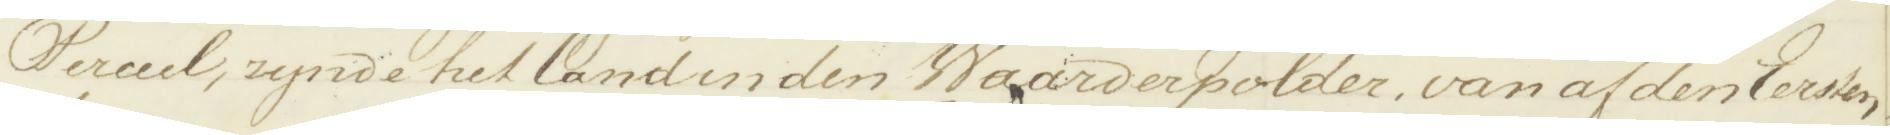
Perceel, zynde het land in den Waarderpolder, van af den Eersten
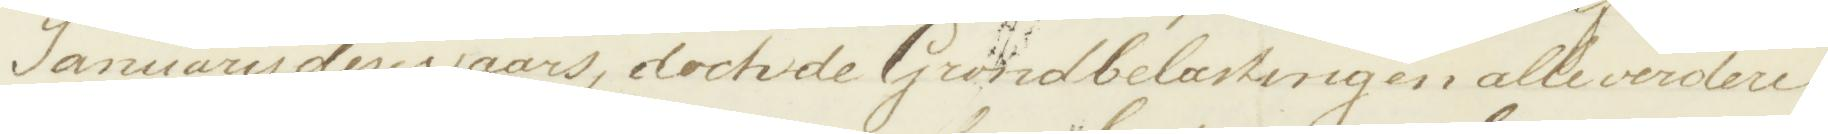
Ianuary dezes jaars, doch de Grond belasting en alle verdere
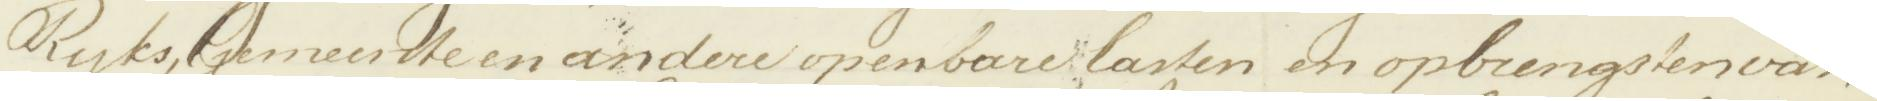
Ryks, Gemeente en andere openbare lasten en opbrengsten van
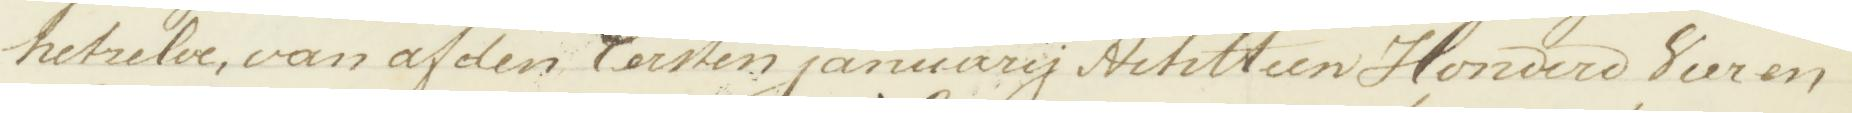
hetzelve, van af den Eersten januarij Achttien Honderd Vier en
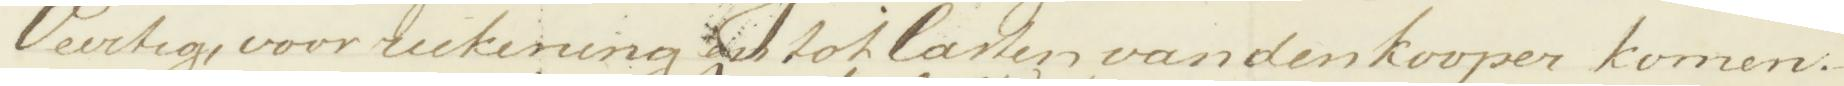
Veertig, voor reekening en tot lasten van den kooper komen.
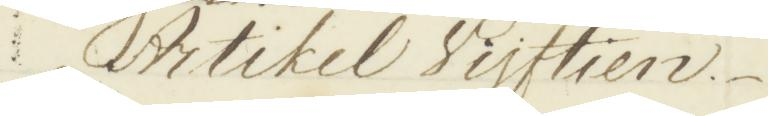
:Artikel Vijftien.-
